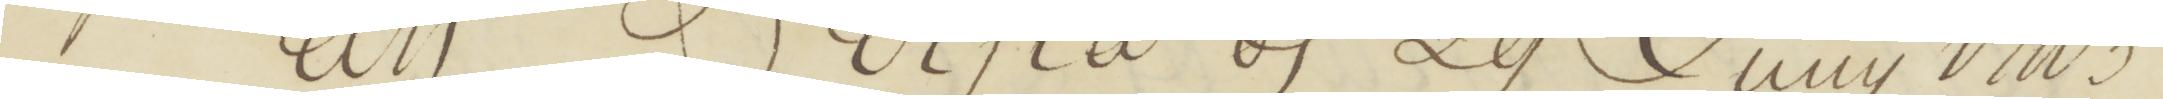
Van Persia den 29 Iunij 1743
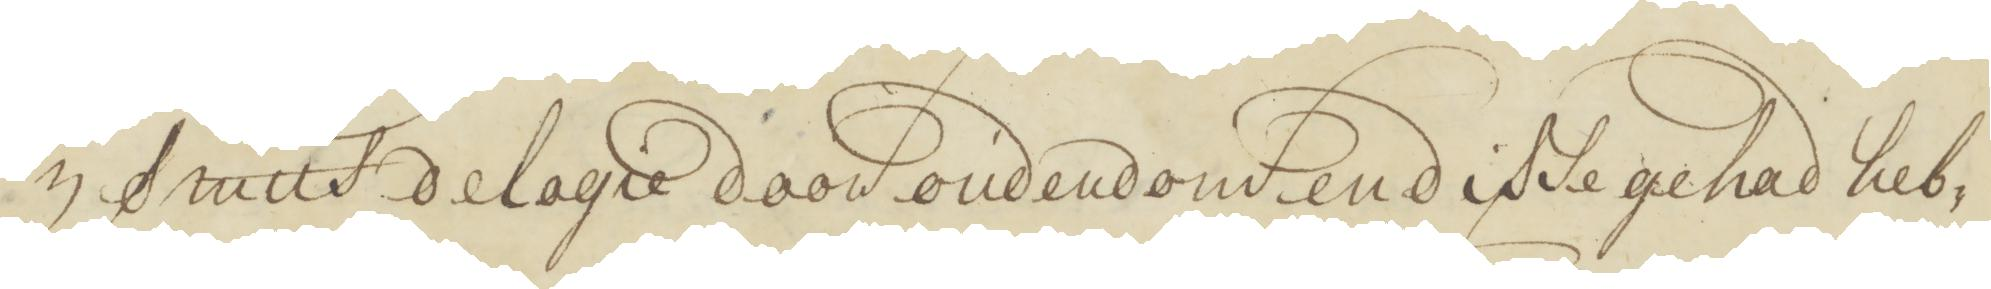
En vermits delogie door ouderdom en diverse gehad heb„
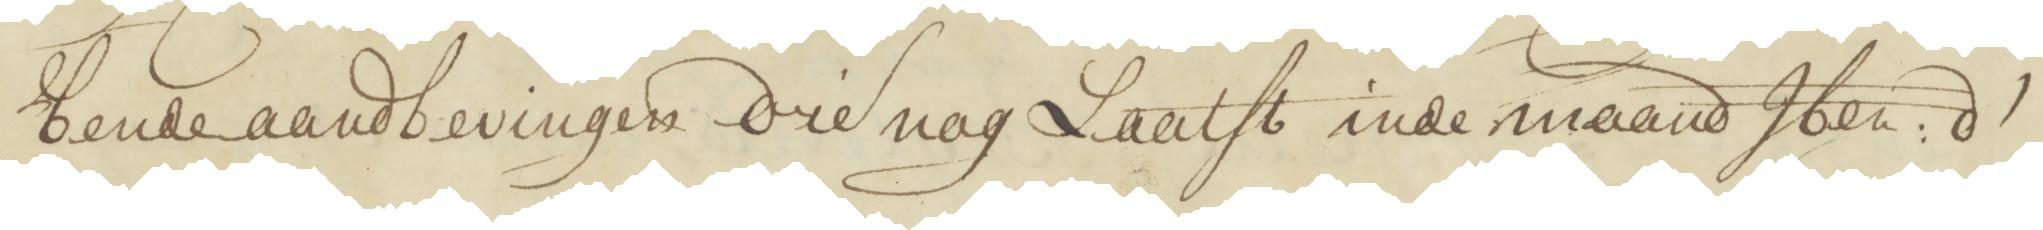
bende aardbevingen die nog laatst inde maand 9ber: d'
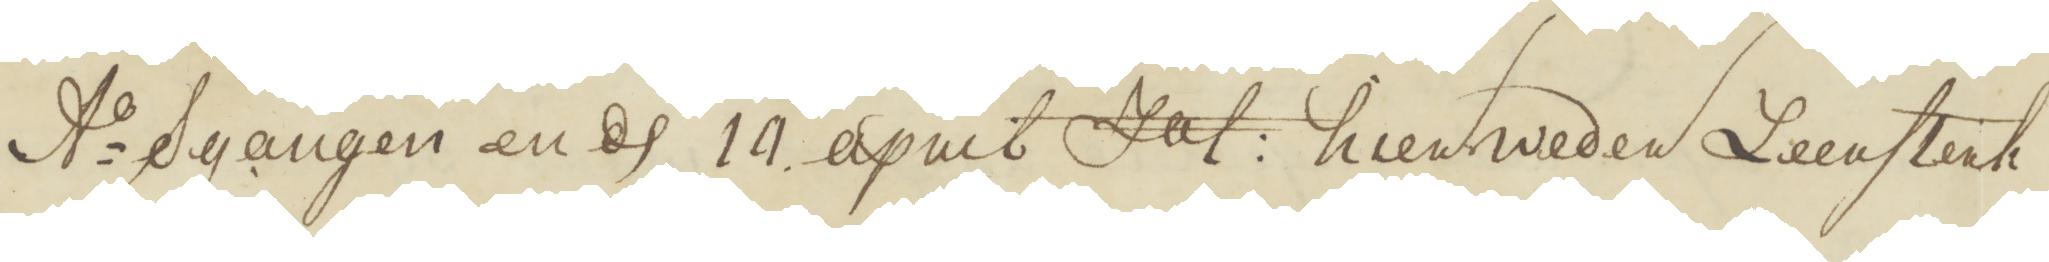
A=o vergangen en den 14.' april Iol: hier weder zeersterk
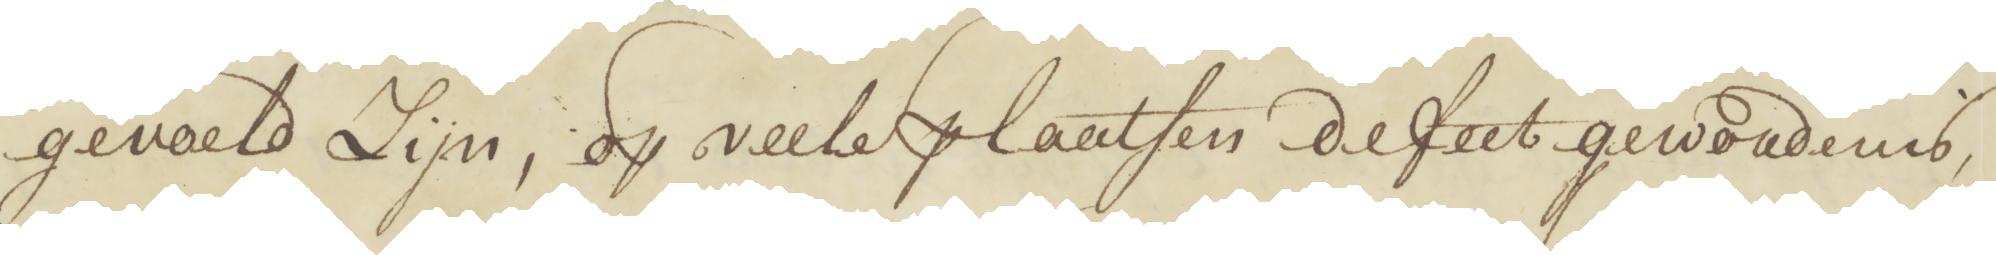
gevoeld zijn, op veele plaatsen defect geworden is,
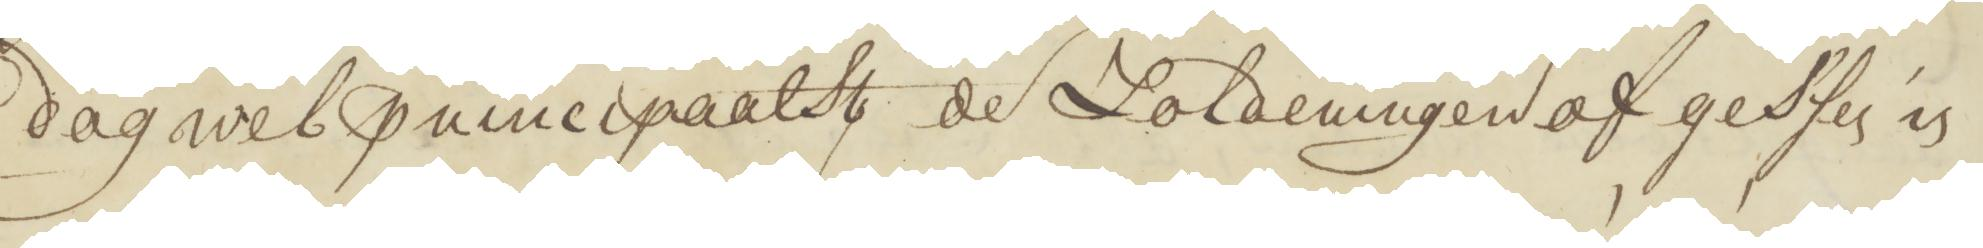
dog wel principaalst de zolderingen of gessen in
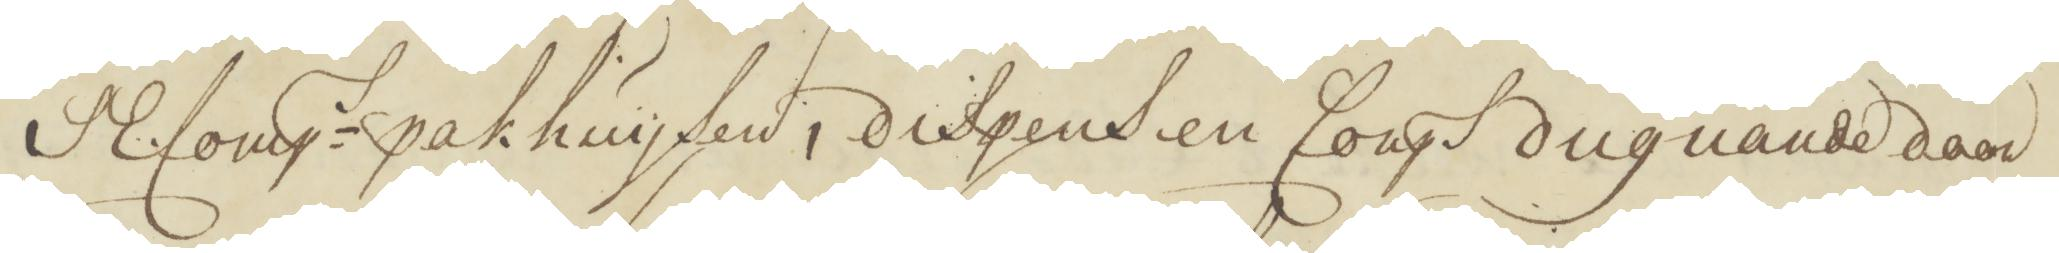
SE:Comp=s pakhuijsen, dispens en Corps duguarde door
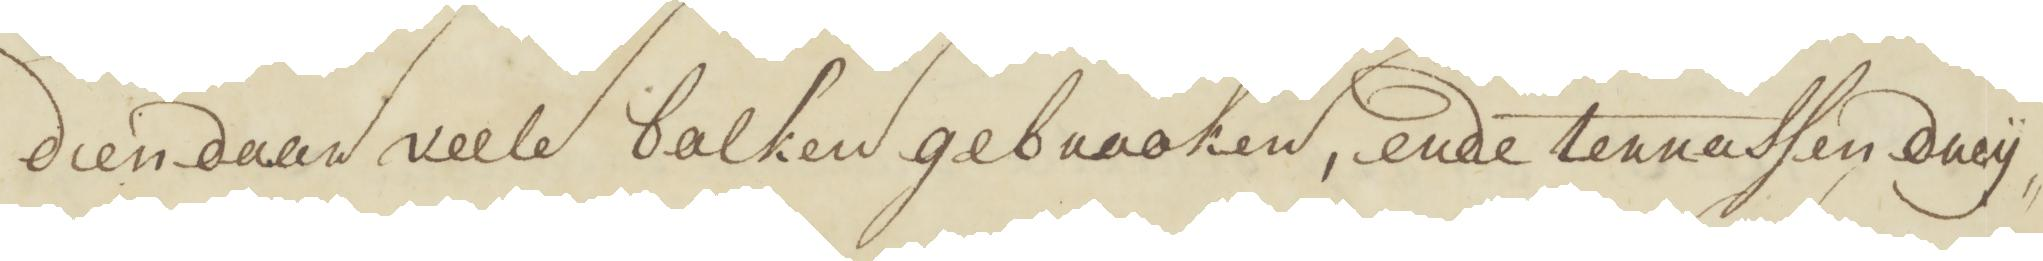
dien daar veele balken gebrooken, ende terrassen dreij„
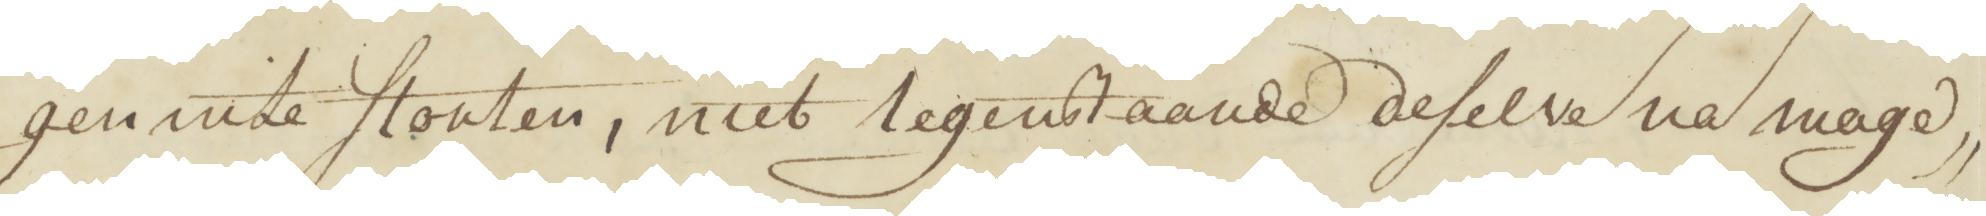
gen inte storten, niet tegenstaande deselve na moge„
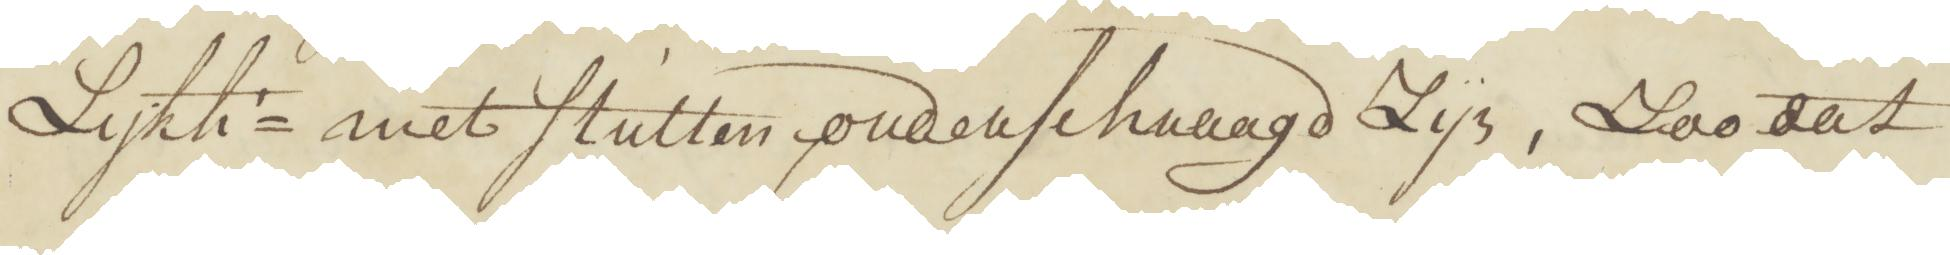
Lijkh=t met stutten onderschraagd zijn, zoo dat
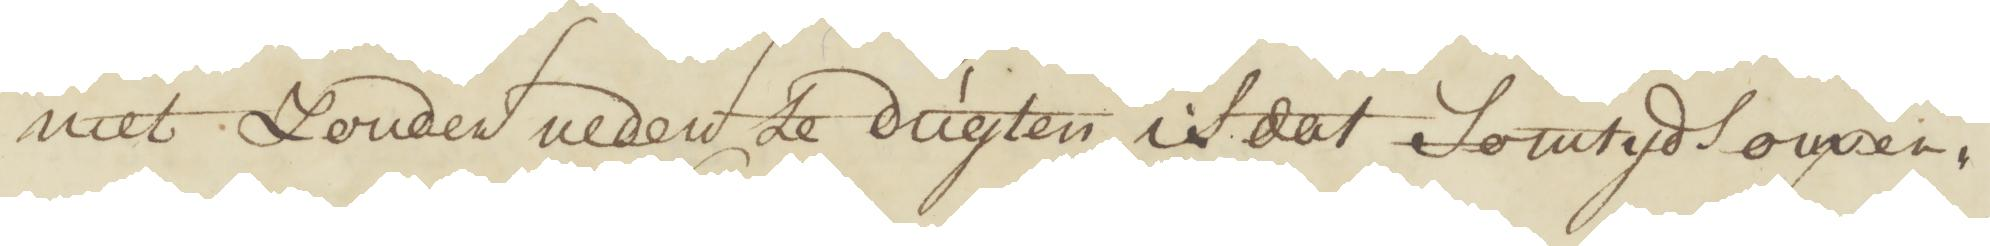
niet zonder reden te dugten is dat somtyds onver„
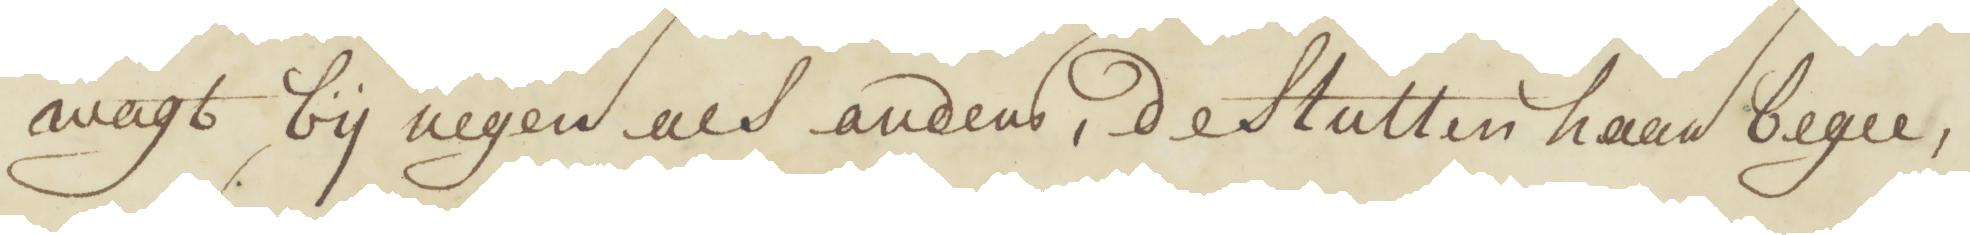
wagt bij regen als anders, de stutten haar begee,
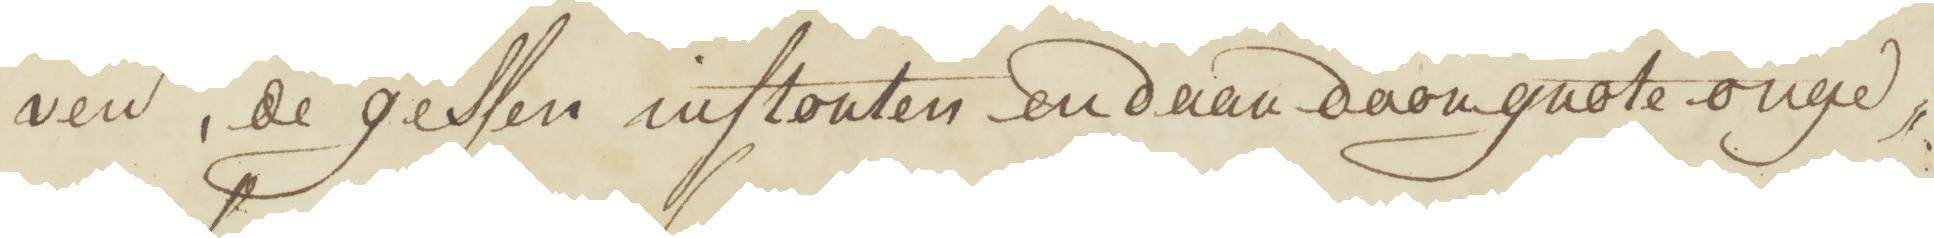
ven, de gessen instorten en daar door grote onge„
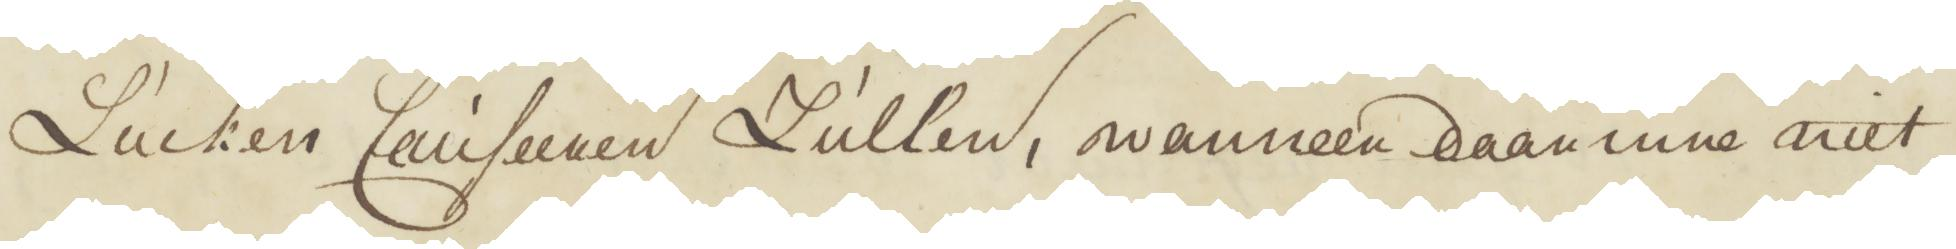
lucken Causeeren zullen, wanneer daarinne niet
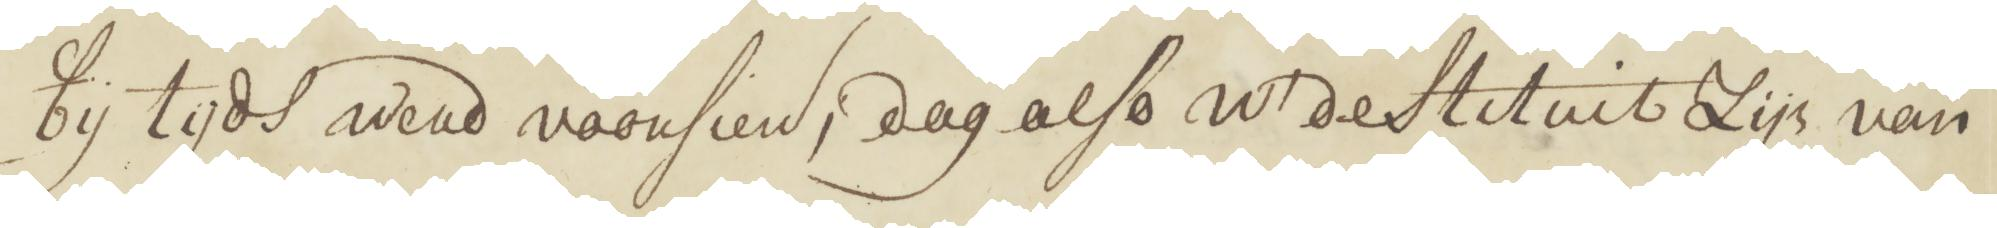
bij tijds werd voorsien, dog also w' destituit zijn van
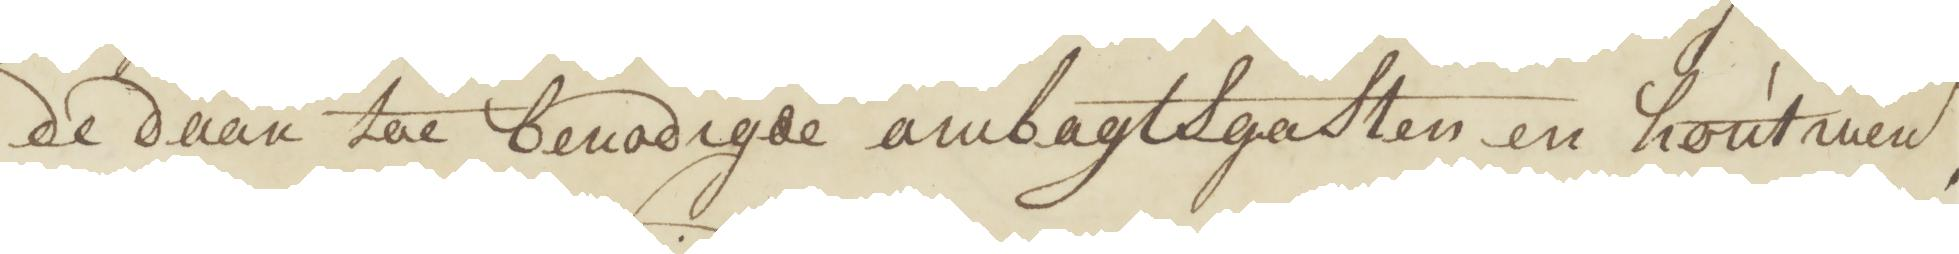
de daar toe benodigde ambagtsgasten en houtwer
